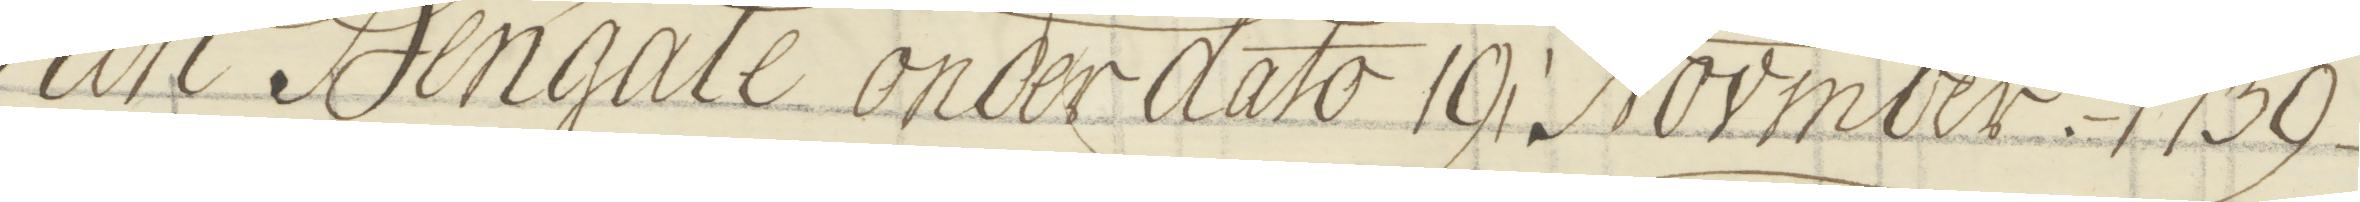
Van Bengale onder dato 19,' Novmber:–1739
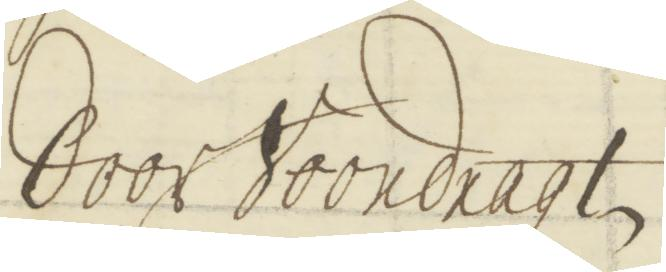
door Voordragt
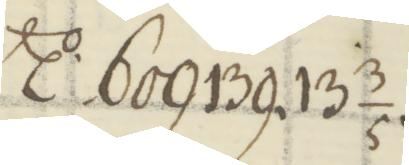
r:o 609139.13 3/5
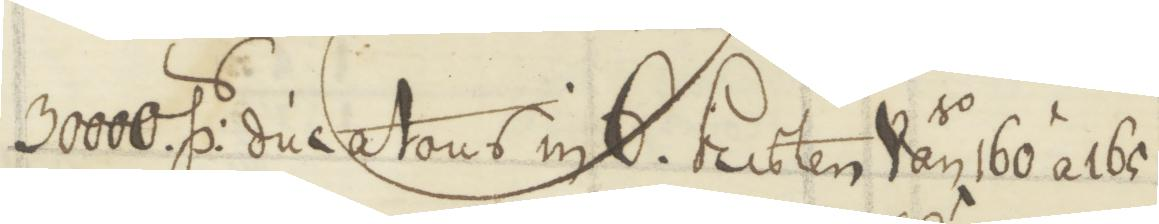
30000. p:s ducatons in 6. kisten van 160^ â 165
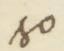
no
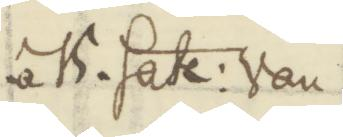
â 15. sak: van
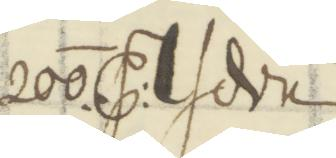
200. p:s IJser
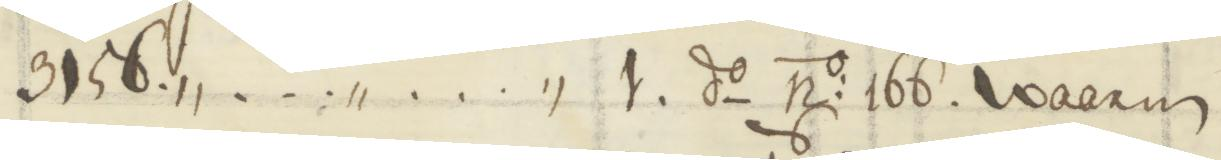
3156. „ - - - „ . . . „ 1. d-o n:o 166. waarn
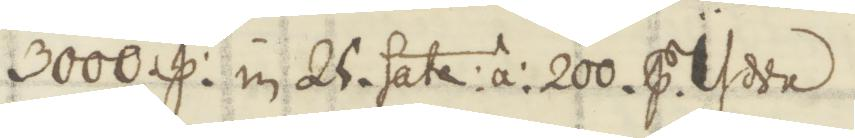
3000 p:s in 25. sake: â: 200. p:s IJser
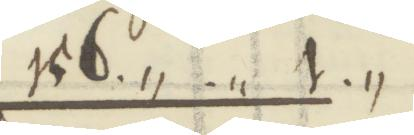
156. „ . „ 1 . „
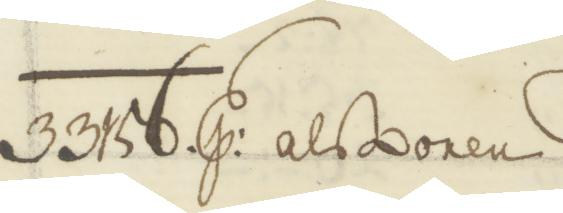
33156. p:s als voren
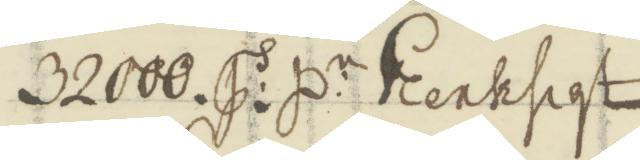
32000. p:s p:r kerksigt
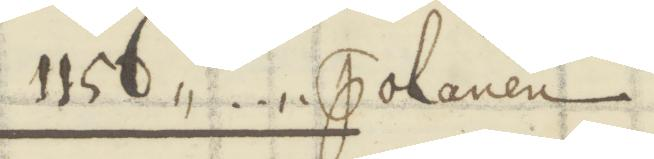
1150 „ . . , , polanen
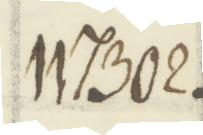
117302
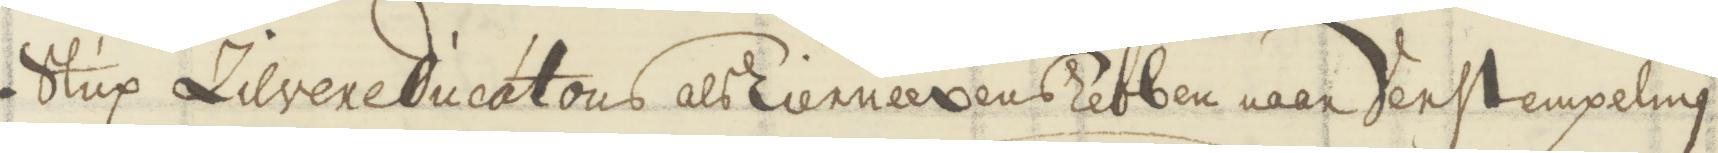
stux zilvere ducatons als hierneevens hebben naar Verstempeling
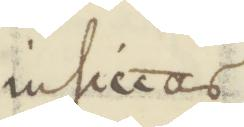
in siccas
